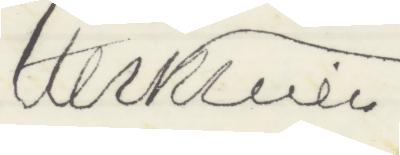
xxx
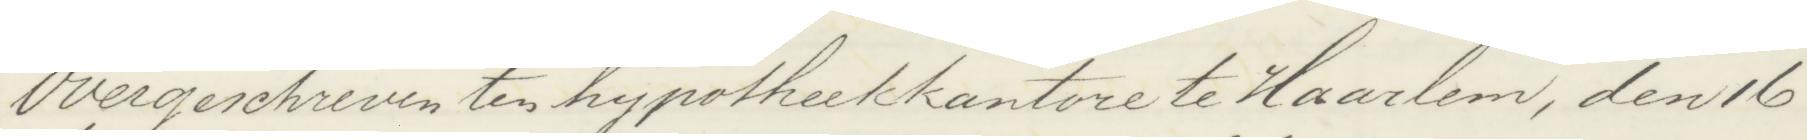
Overgeschreven ten hypotheekkantore te Haarlem, den 16
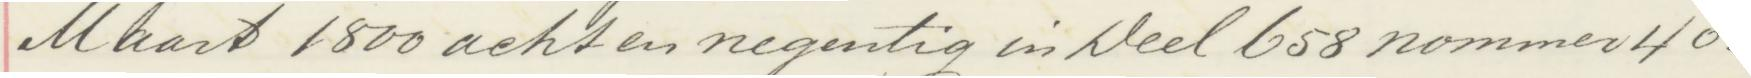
Maart 1800 acht en negentig in Deel 658 nommer 40.
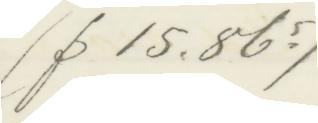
/ƒ 15.86-5/
